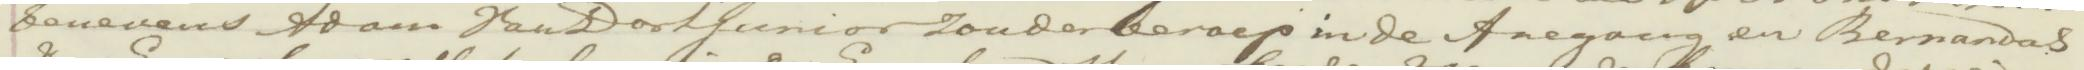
benevens Adam Van Dort junior zonder beroep in de Anegang en Bernardus
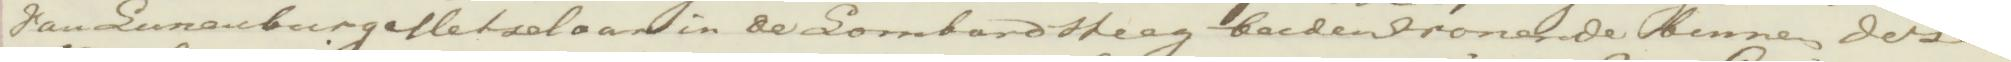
Van Lunerburg Metselaar in de Lombardsteeg beiden wonende binnen deze
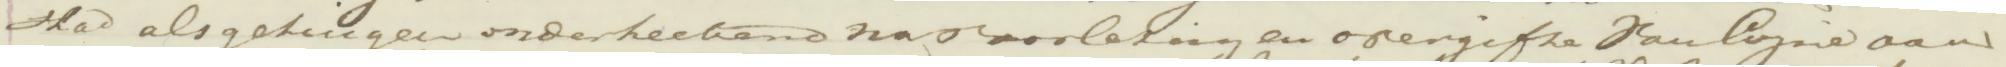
stad als getuigen onderteekend na voorlezing en overgifze Van Copie aan
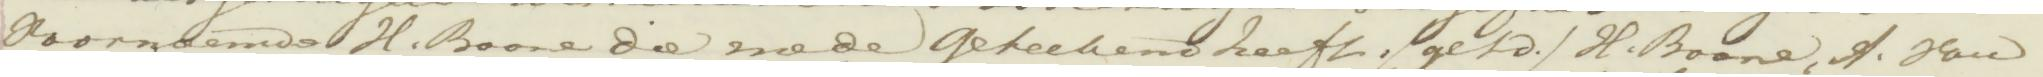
Voornoemde H. Boone die mede Geteekend heeft. (getd.) H. Boone, A. Van
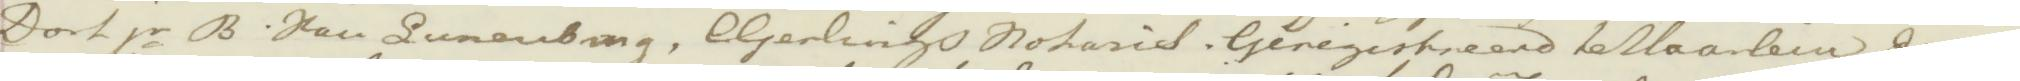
Dort j=r B. Van Lunerburg, CGerlings Notaris, Geregistreerd te Haarlem den
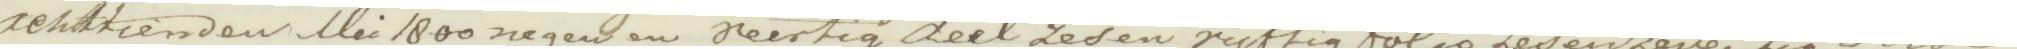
achttienden Mei 1800 negen en veertig deel zes en vijftig folio zes enzeventig Verso
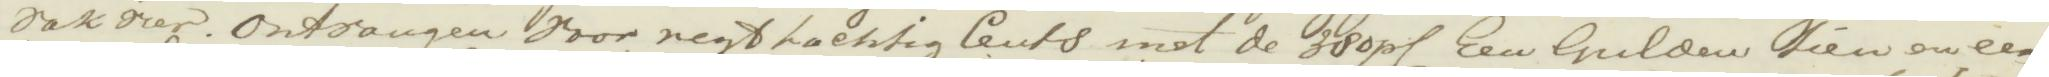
vak vier. Ontvangen Voor regt tachtig Cents met de 38 opC Een Gulden tien en een
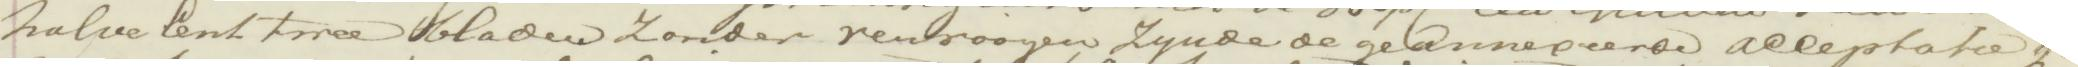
halve Cent twee bladen zonder renvooyen Zynde de geannexeerde acceptatie ge
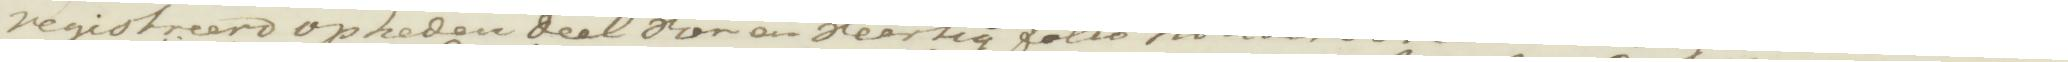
registreerd op heden deel vier en veertig folio honderd drie en dertig recto Vak Een
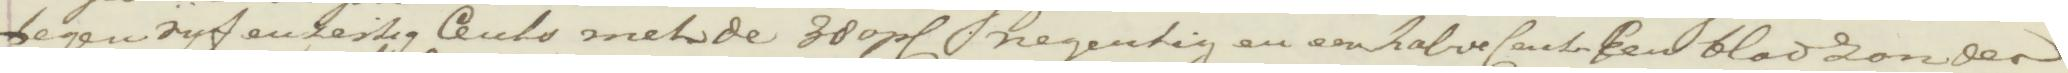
tegen vijf en zestig Cents met de 38 opC negentig en eenhalve Cent Een blad zonder
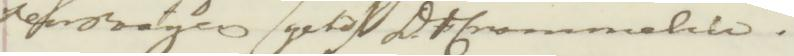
Renvooijen (getd) DFCrommelin.
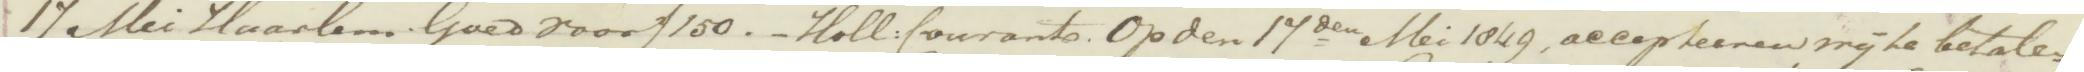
17 Mei Haarlem, Goed voor ƒ 150. - Holl: Courants. Op den 17=den Mei 1849, accepteeren wij te betalen
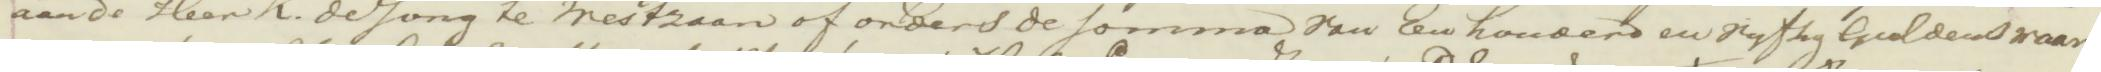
aan de Heer K. de Jong te Westzaan of orders de somma van Een honderd en vyftig Guldens waar
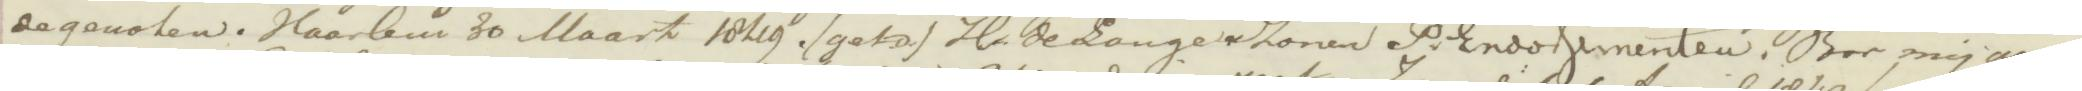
de genoten. Haarlem 30 Maart 1849. (get.d.) H. de Lange & Zonen P. Endossemeten, Voor mij aan
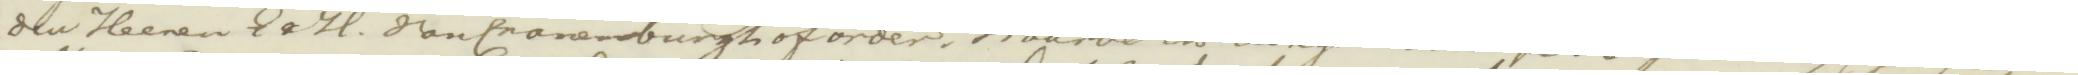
den Heeren E & H. Van Cranenburgh of order, waarde in reekg: Zaandijk 1 April 1849. (getd) Klaas
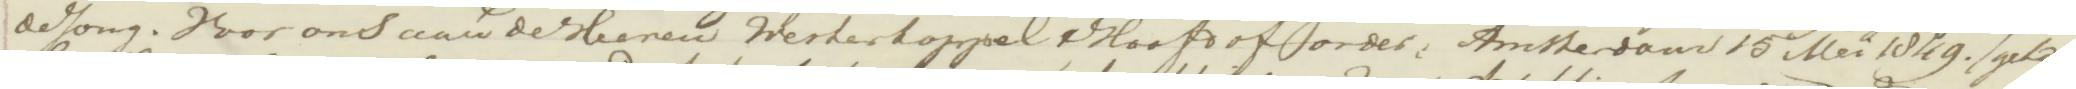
de Jong. Voor ons aan de Heeren Westerkoppel & Hoofd of order: Amsterdam 15 Mei 1849. (getd.)
